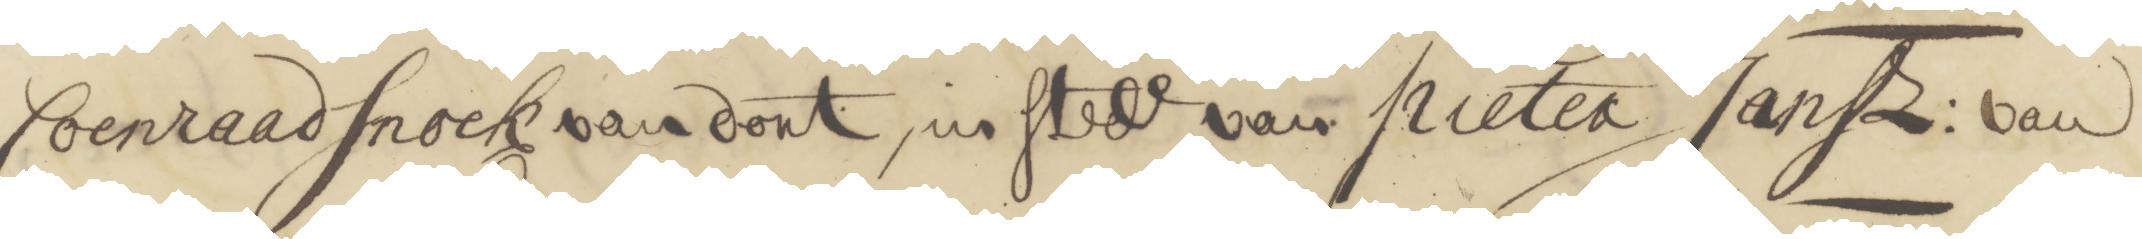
Coenraad Snoek van dort, in stede van pieter Jansz: van
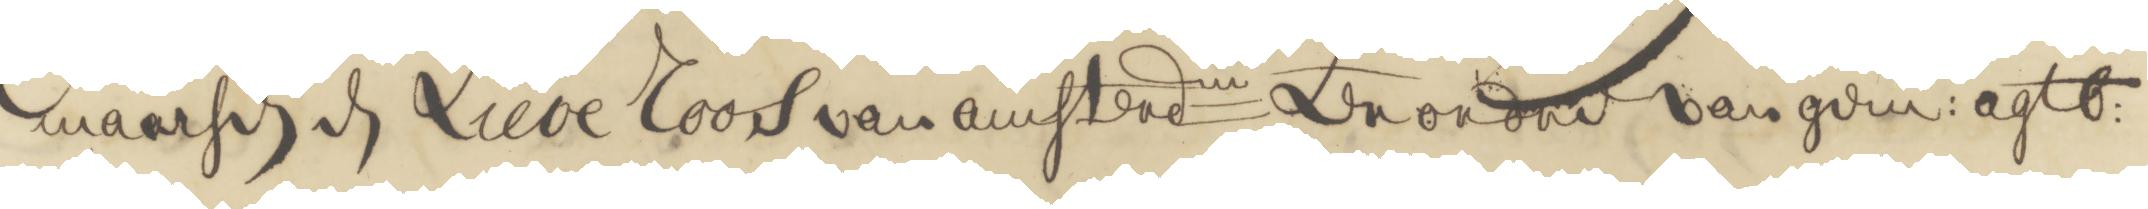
maarsen en Lieve Roos van amsterd=m ter ordre van gem: agtb:
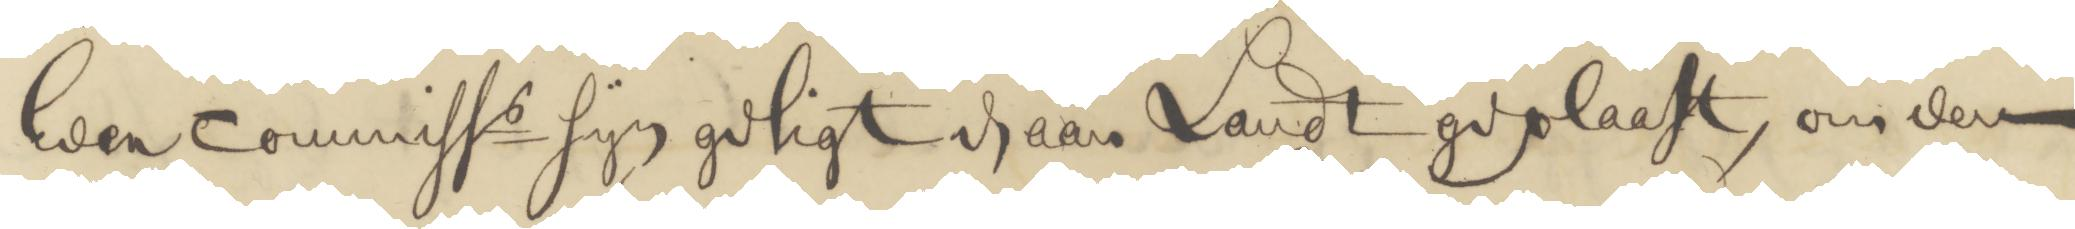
heer Commiss=s sijn geligt en aan Landt geplaast, om den
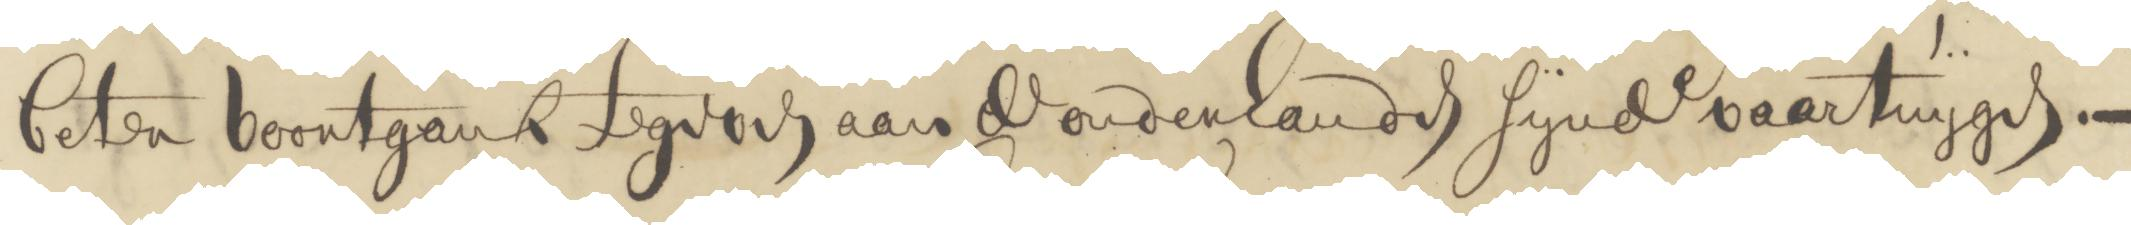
beter voortgank te geven aan de onderhanden Sijnde vaartuijgen. —
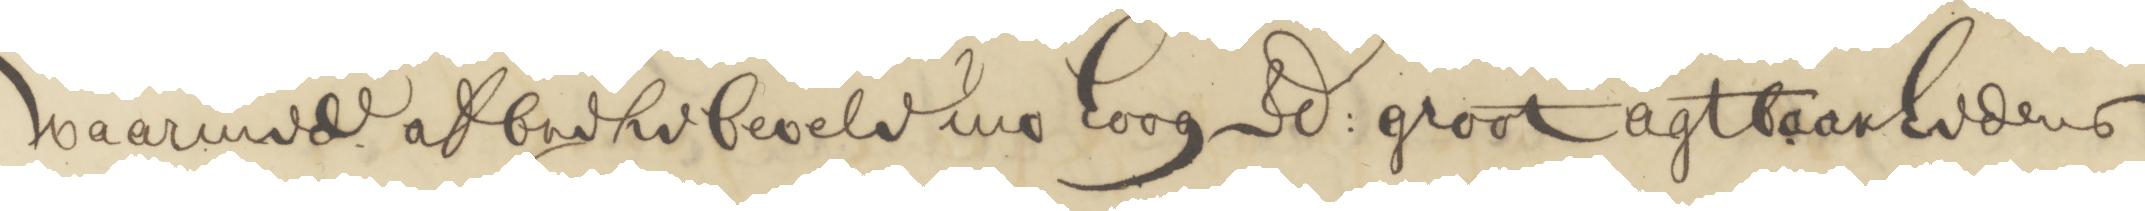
waarmede afbreke bevele uw hoog Ed: groot agtbaarhedens
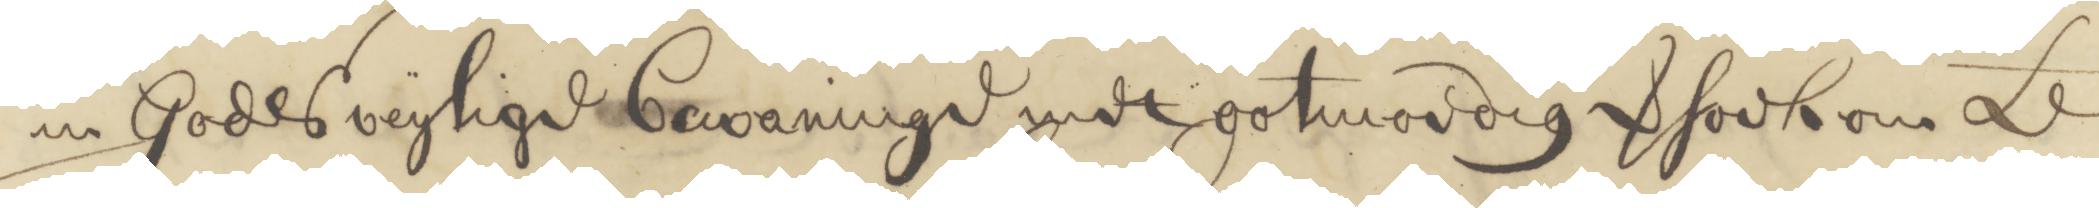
in Godes veijlige bewaringe met ootmoedig versoek om te
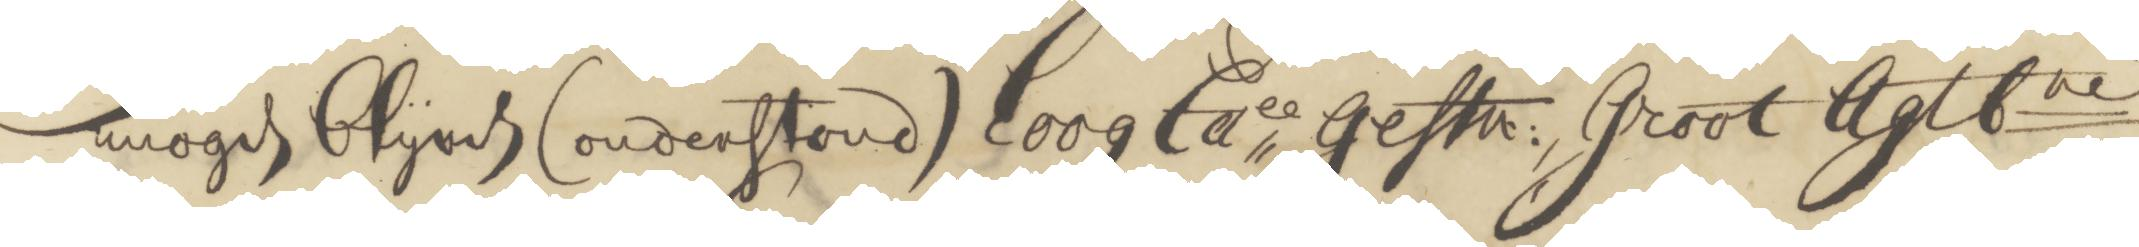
mogen blijven (onder stond) hoog Ed„le gestr: Groot Agtb=re
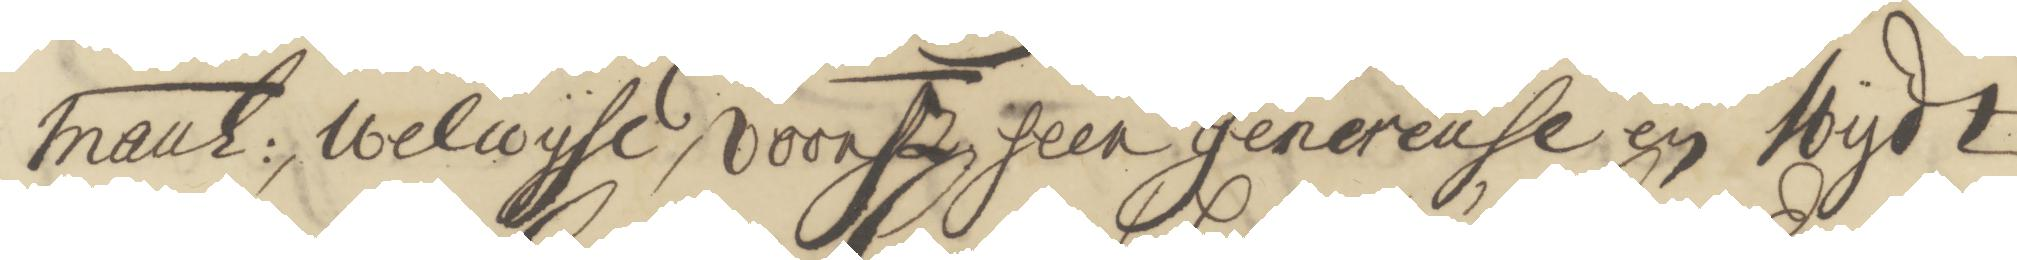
manh:, welwijse, voorsz seer genereuse en Wijdt
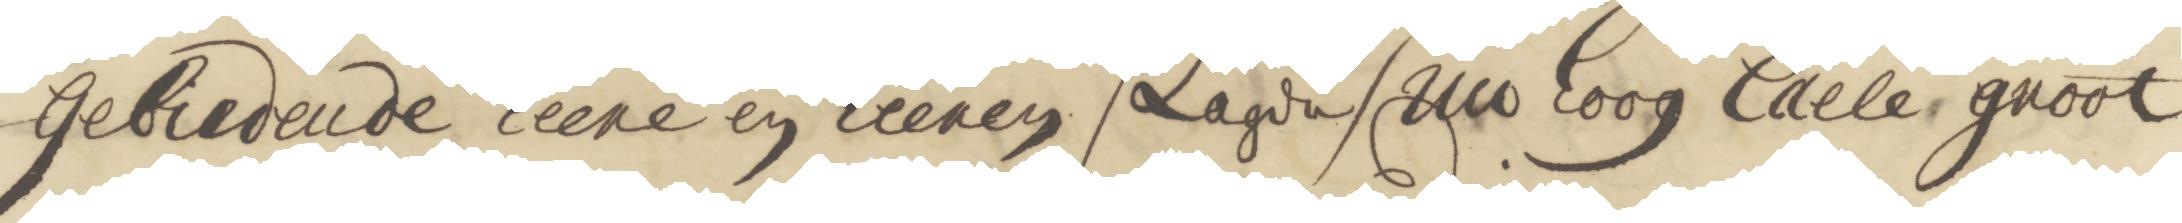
gebiedende heere en heeren / Lager/ uw hoog Edele groot
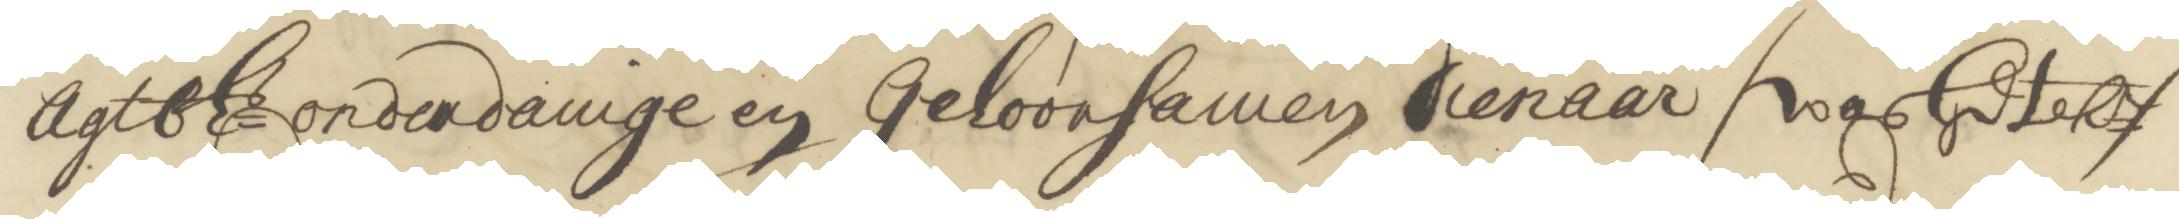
Agtbh=s onderdanige en gehoorsamen dienaar /was Getek=/
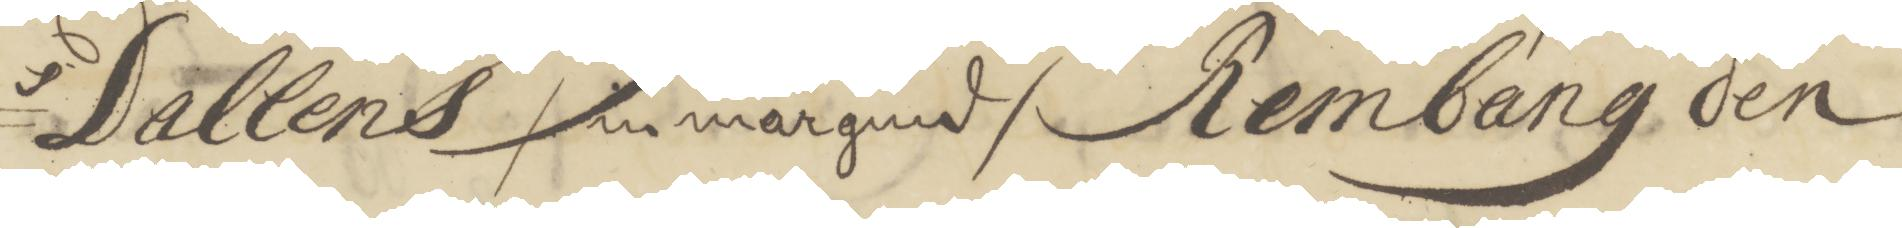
=s Dallens / in margine / Rembang den
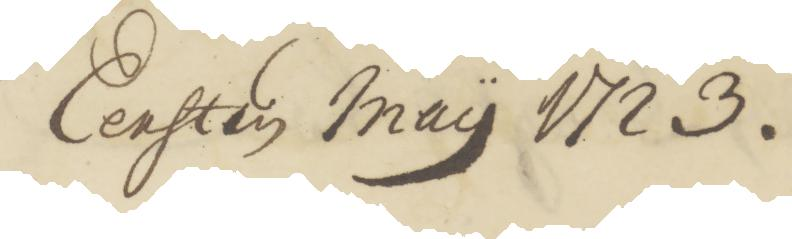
Eersten Maij 1723.
